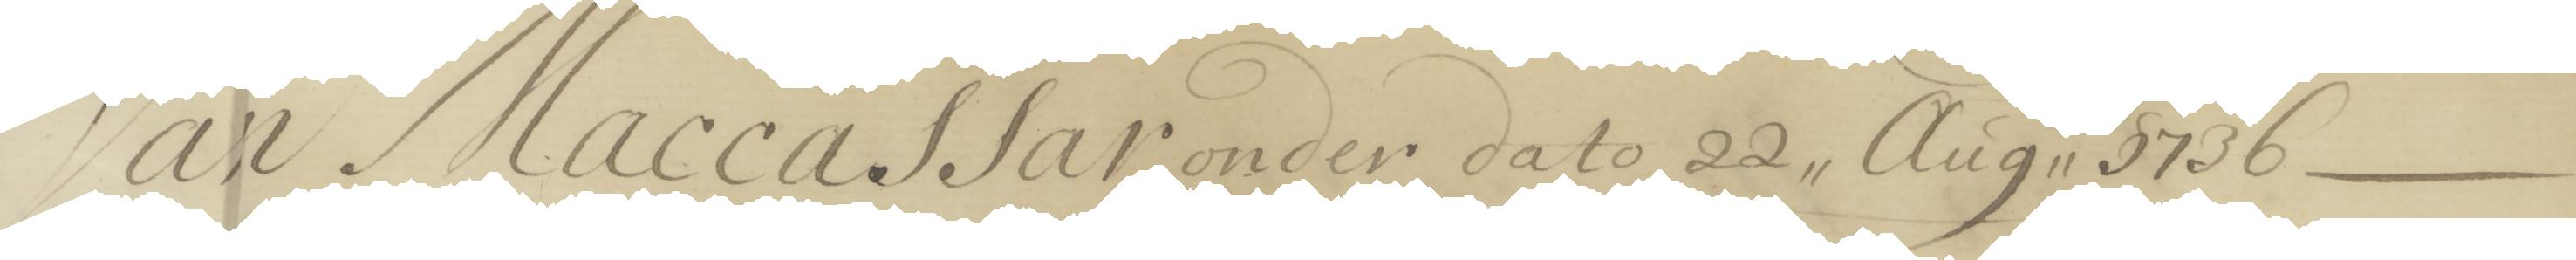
Van Maccassar onder dato 22„ Aug„ti 1736 —
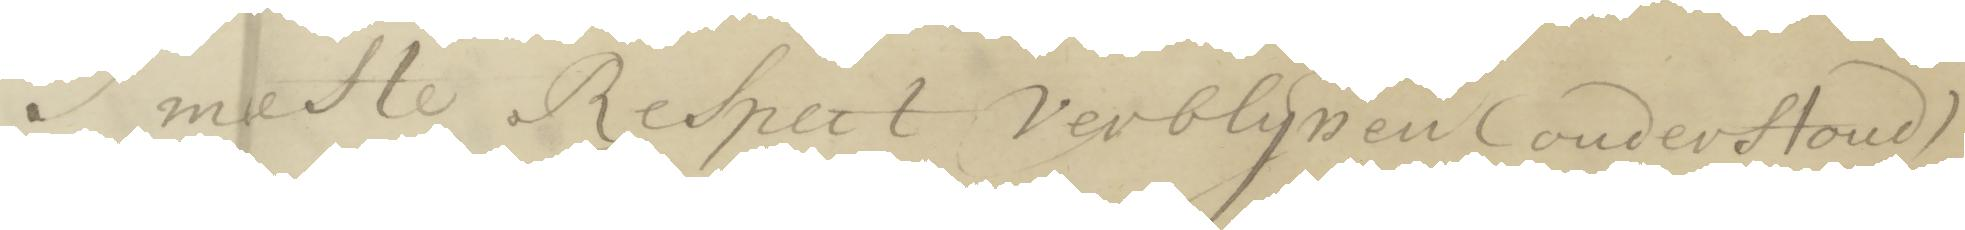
T meeste Respect verblijven (onderstond)
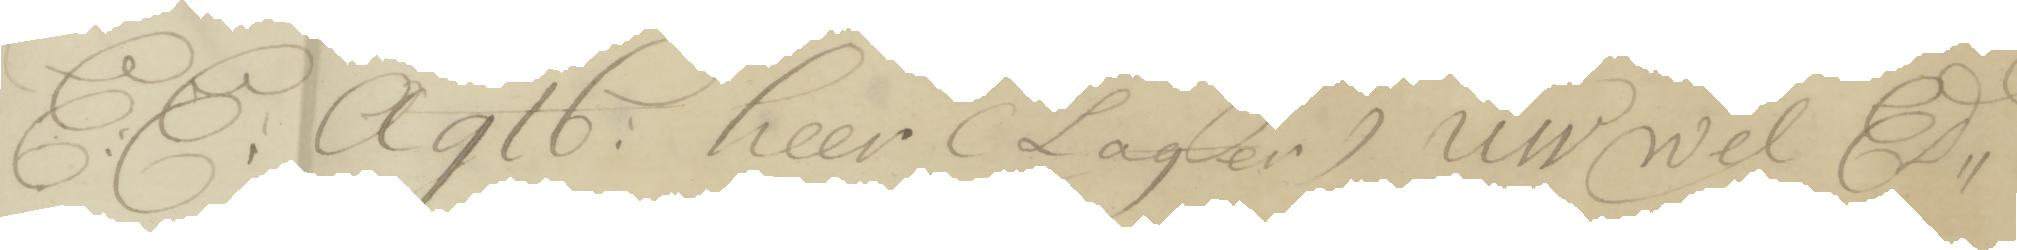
E:E: Agtb: heer (lager) uw wel Ed„l
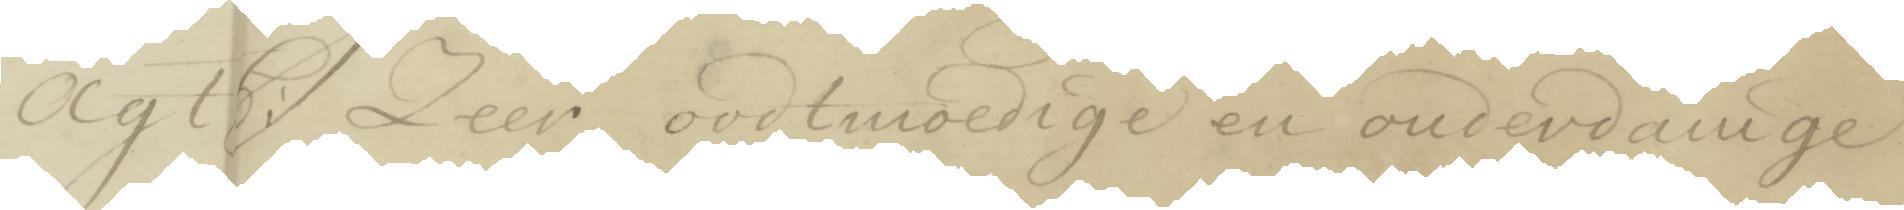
agtb: zeer oodtmoedige en onderdanige
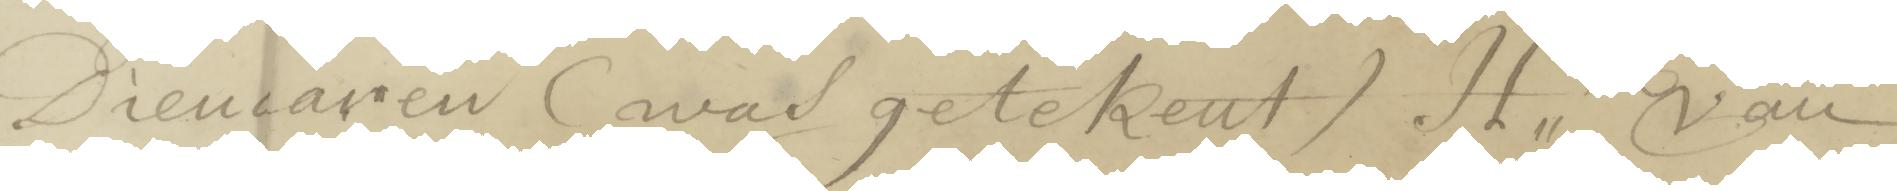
Dienaaren (was getekent) H„k van
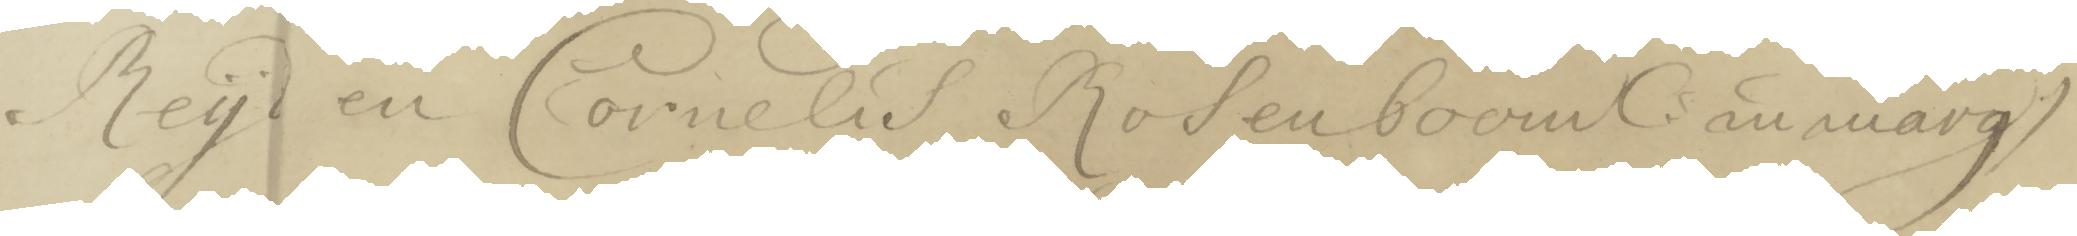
Reijd en Cornelis Rosenboom (:in marge:)
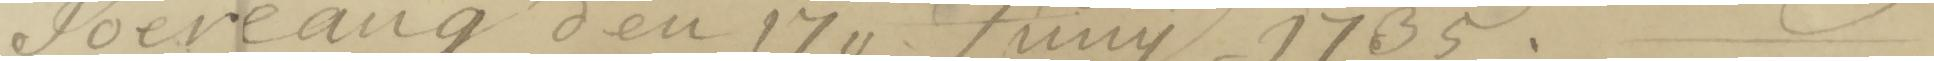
soereang den 17„e Junij 1735. —
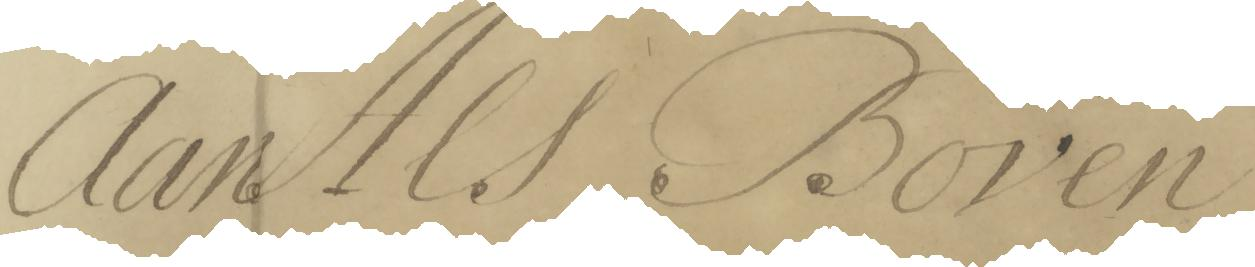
Aan Als Boven
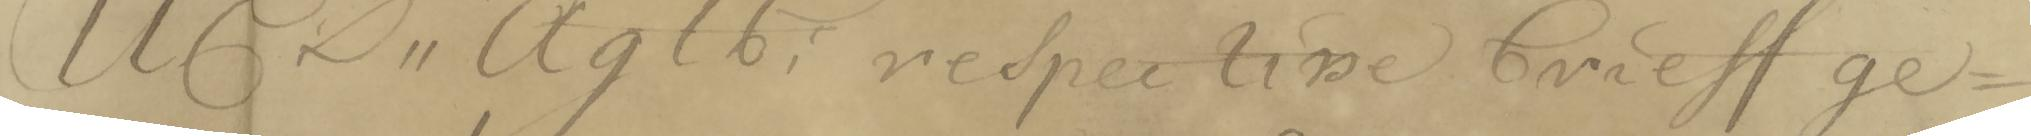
UED„e Agtb: respective brieff ge=
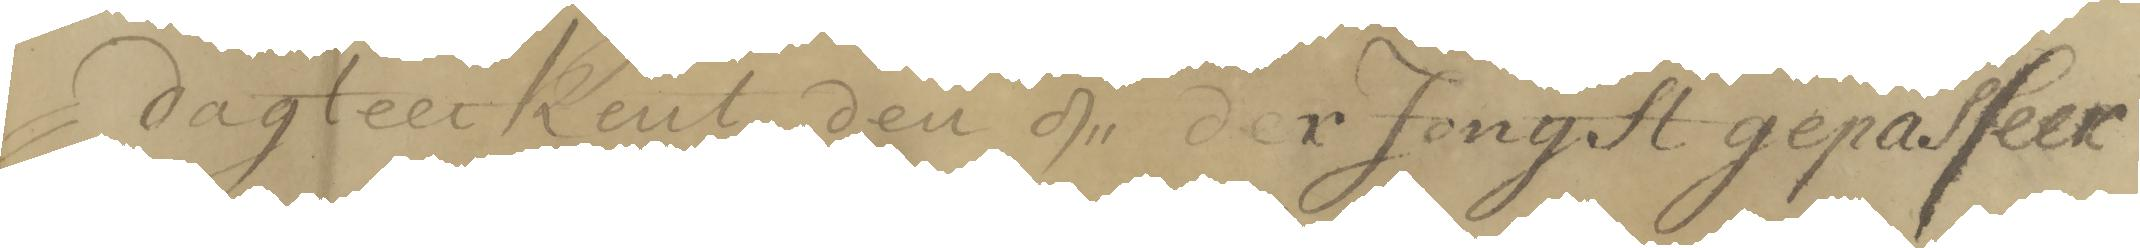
=dagteeckent den 8„e der Jongst gepasseer
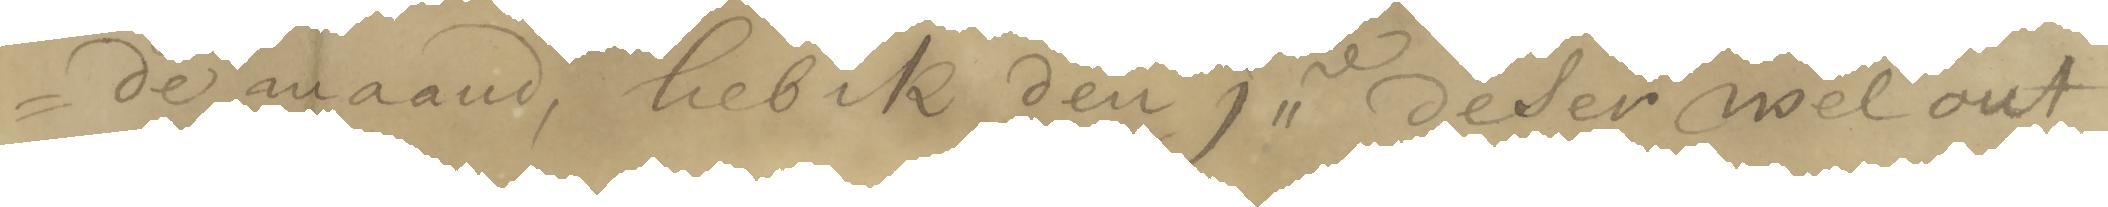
=de maand, heb ik den 1„e deser wel ont
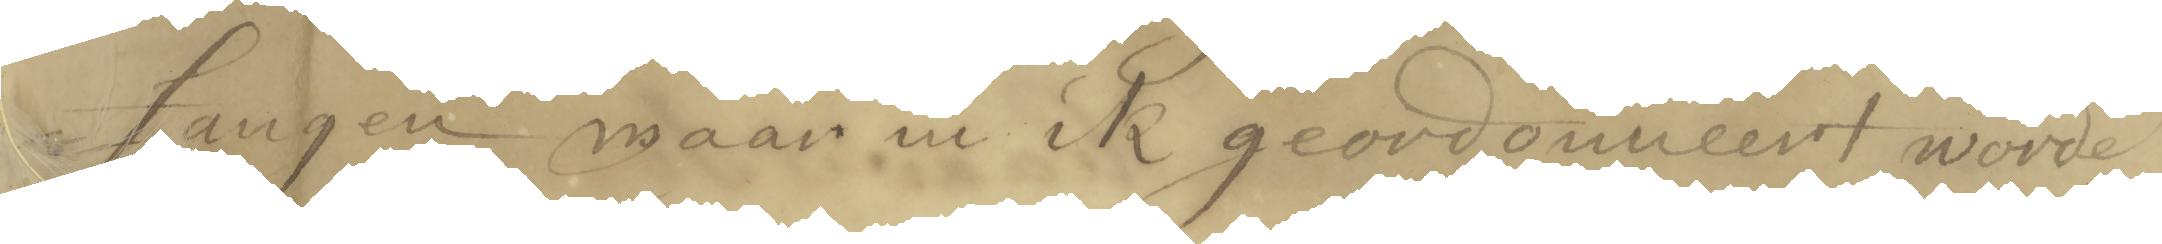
=fangen waar in ik geordonneert worde
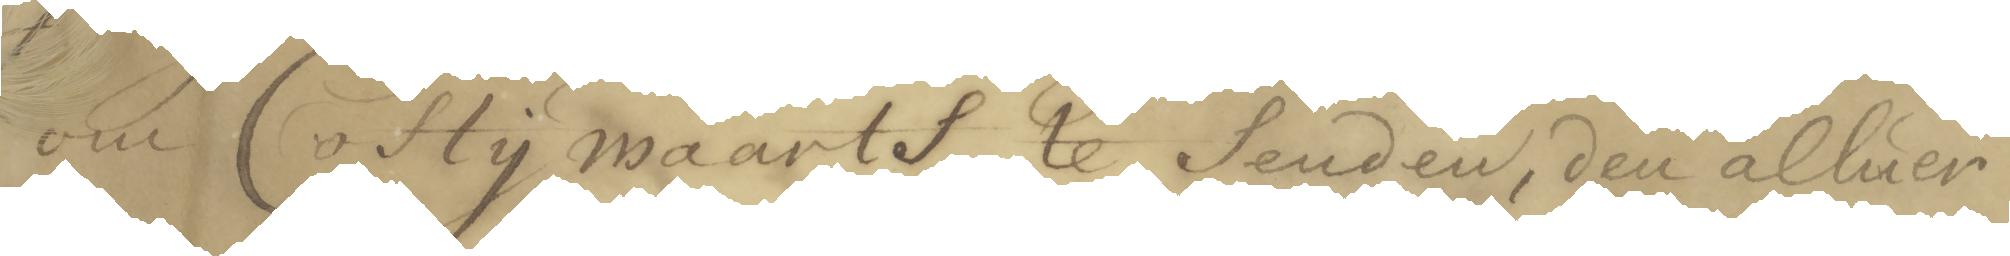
om Costijwaarts te senden, den alhier
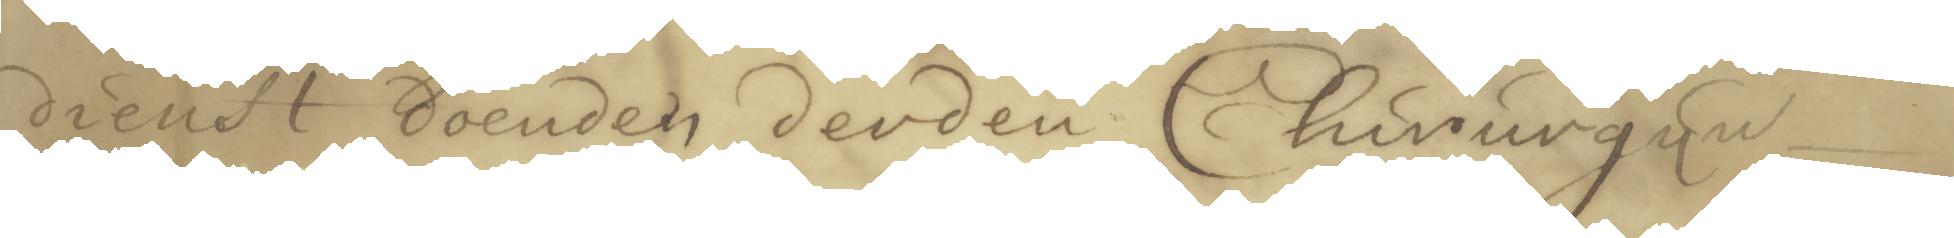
dienst doenden derden Chirurgijn —
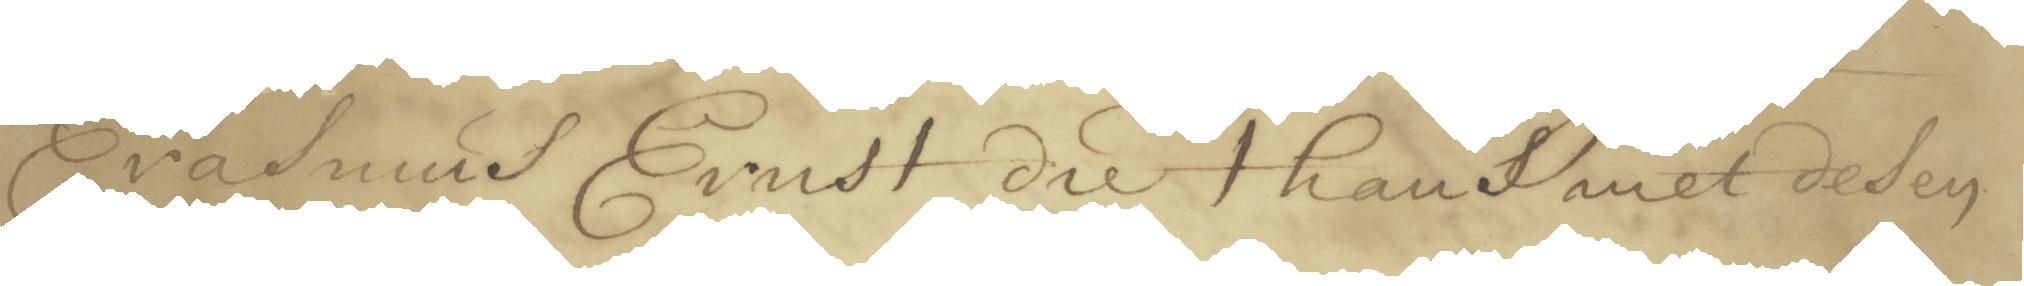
Erasmus Ernst die thans met desen
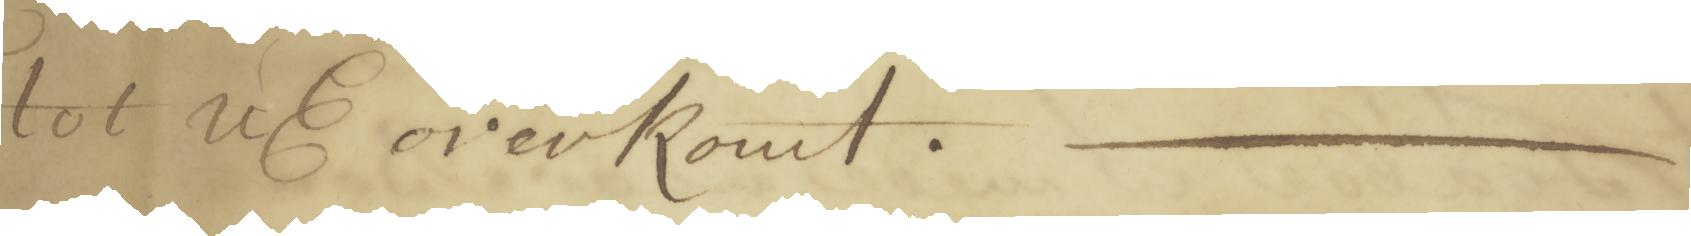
tot uE overkomt. —
